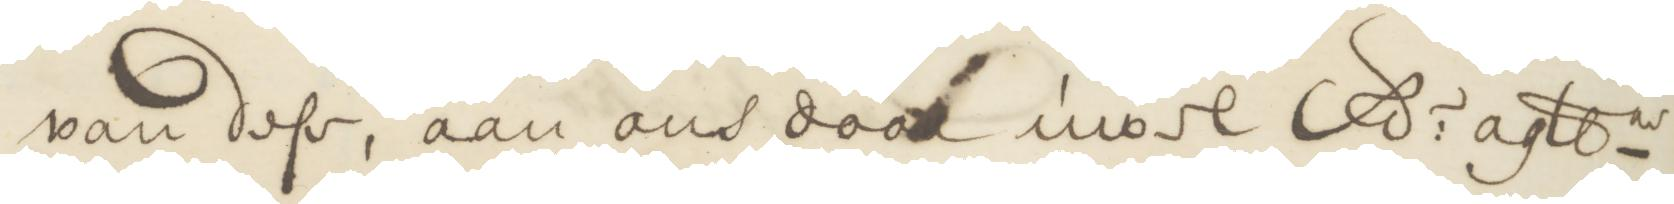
van dese, aan ons door uwel Ed:e agtb=re
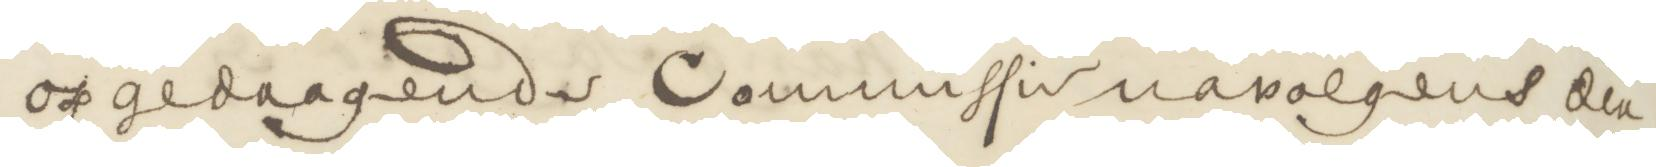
op gedaagende Commissie navolgens der
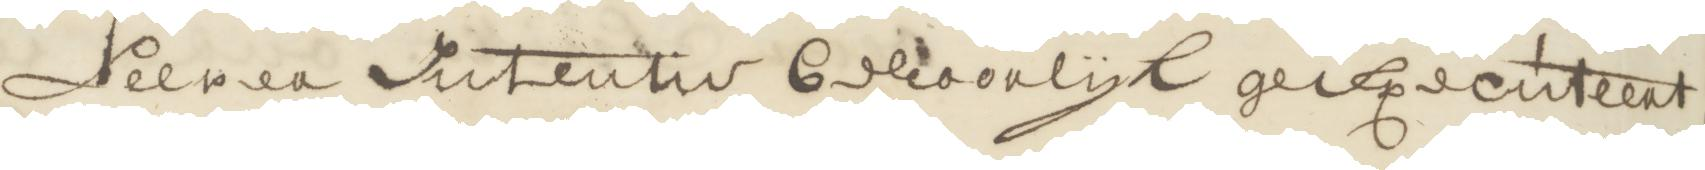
seeven Intentie behoorlijk geExecuteert
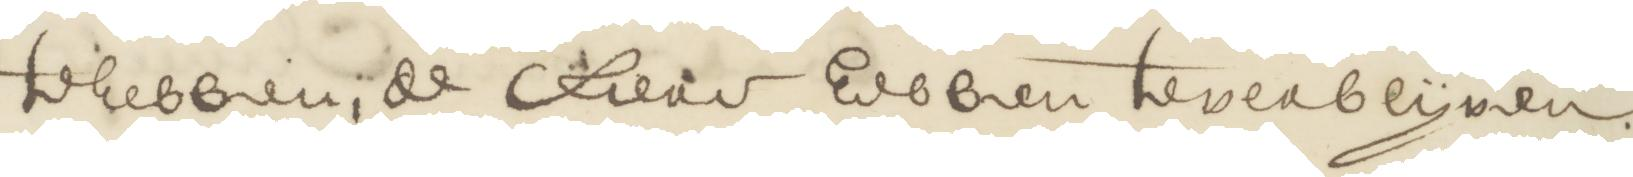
tehebben, de Eere hebben teverblijven.
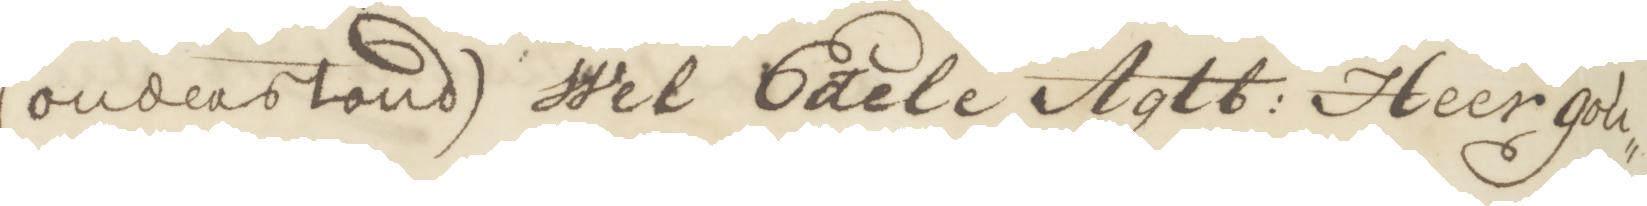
(onderstond) wel Edele Agtb: Heer gou„
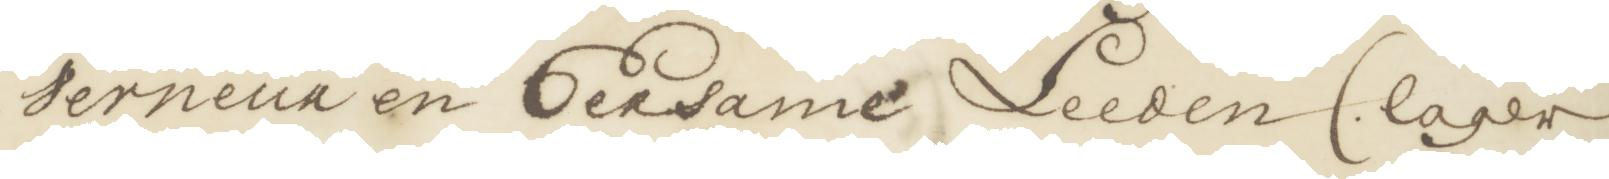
verneur en Eersame Leeden (lager)
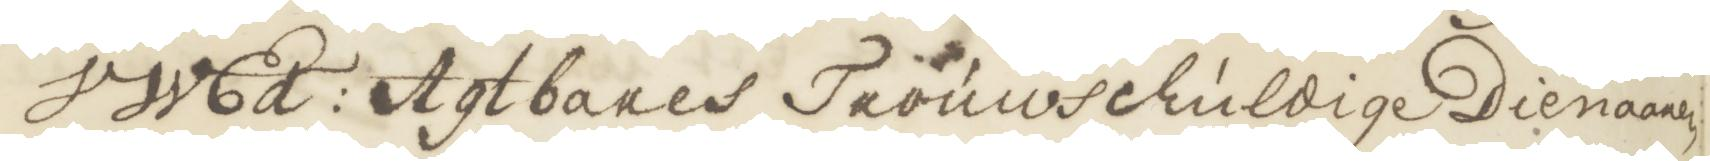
UWEd: Agtbares Trouwschuldige Dienaaren
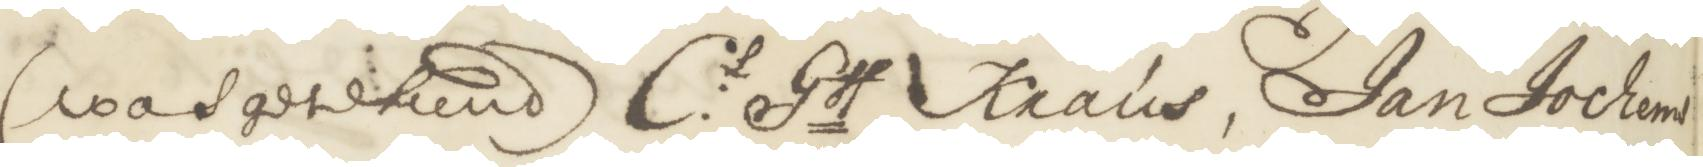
(was getekend) C:s G=ff Kraus, Jan Jochems
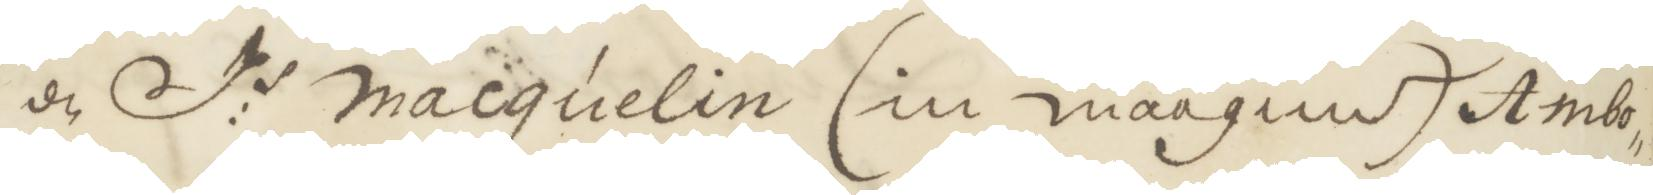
en J:s macquelin (in margine) Ambo„
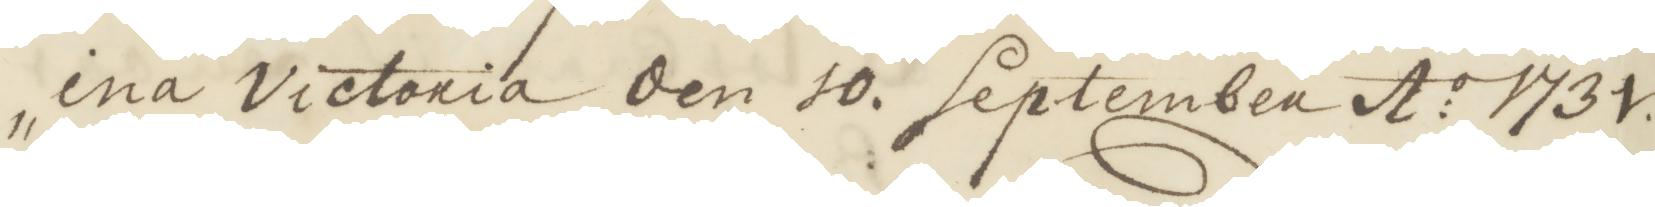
„ina Victoria den 10. September A:o 1731.
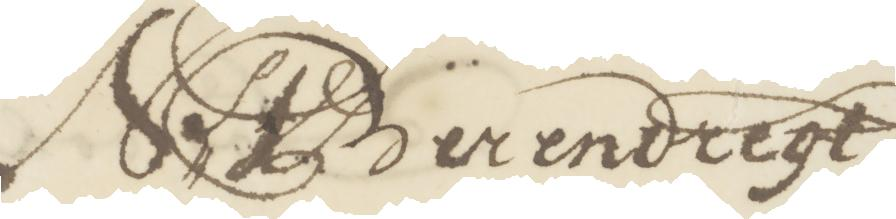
N„s Berendregt
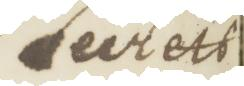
Secrets
